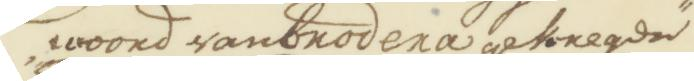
„woord vanbrodera gekregen
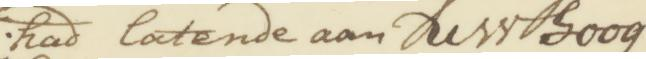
had latende aan UW Hoog
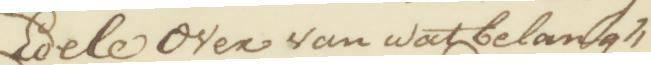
Edele over van wat belang„
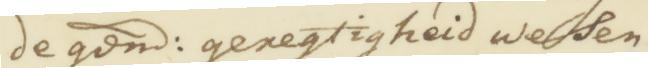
de gen: geregtigheid wesen
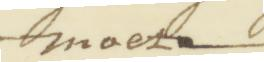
moet —
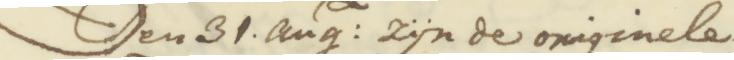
Den 31. aug: zijn de originele
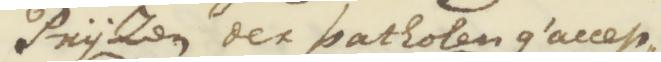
Prijzen der patholen g'accep„
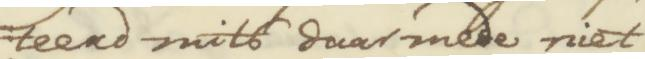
teerd mits daar mede niet
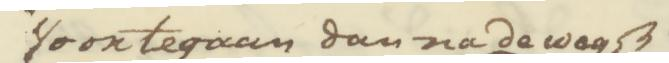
Voor tegaan dan na de wegh
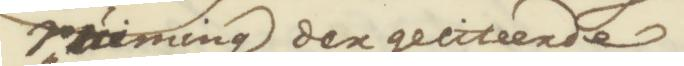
r„uiming der geciteerde
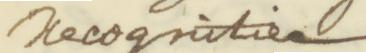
Recognitie
